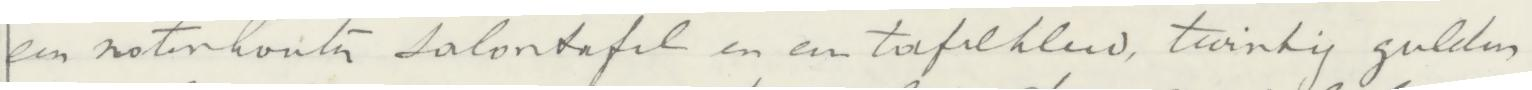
een notenhouten salontafel en een tafelkleed, twintig gulden
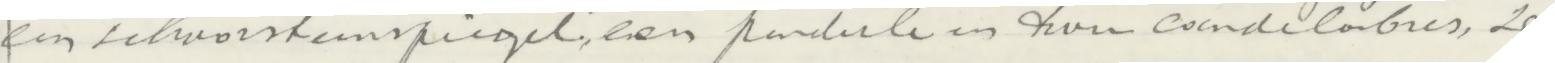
een schoorsteenspiegel, een pendule en twee candelabres, ze
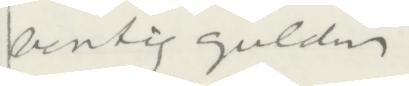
ventig gulden
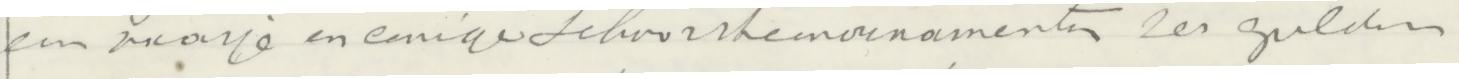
een vaasje en eenige Schoorsteenornamenten zes gulden
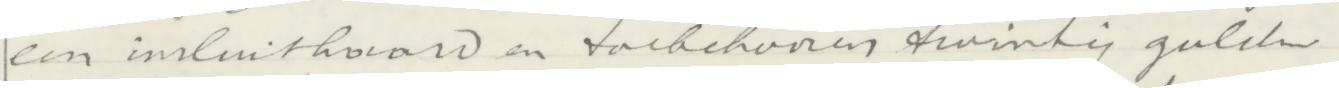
een insluithaard en toebehooren twintig gulden
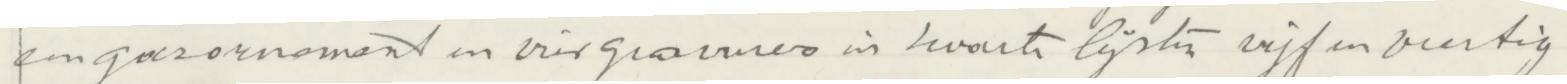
den gazornement en vier gravures in zwarte lijsten vijf en veertig
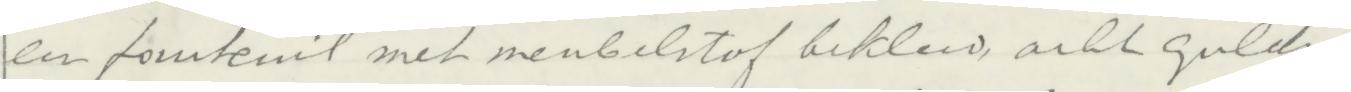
een fauteuil met meubelstof bekleed, acht gulden
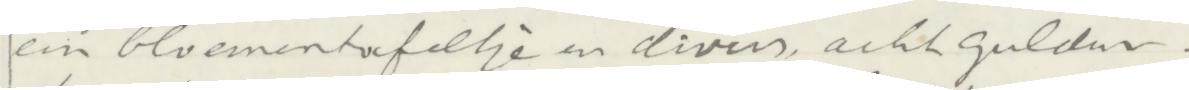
een bloementafeltje en divers, acht gulden
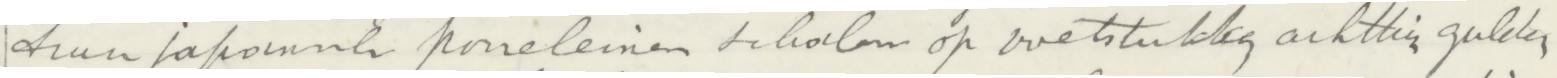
tien japansch porseleinen schalen op voetstukken achttien gulden
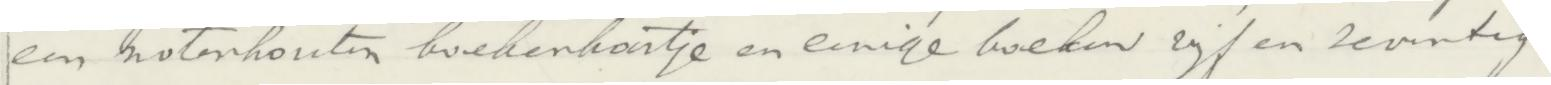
een notenhouten boekenkastje en eenige boeken vijf en zeventig
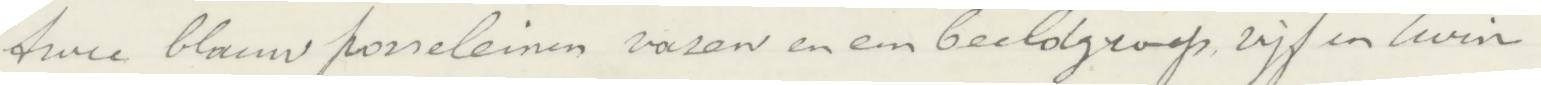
twee blauw porseleinen vazen en en beeldgroep, vijf en twin
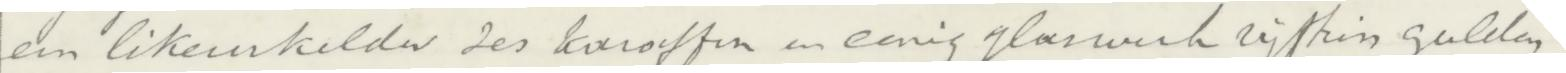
en likeurkelder zes karaffen en eenig glaswerk vijftien gulden
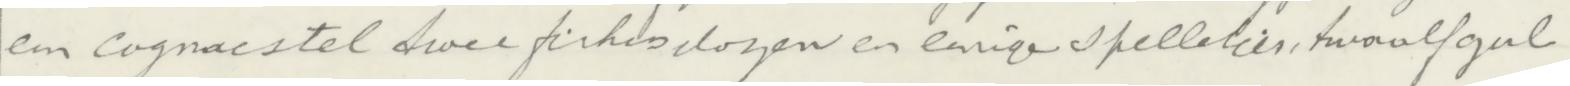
een cognacstel twee fiches dozen en eenige spelletjes, twaalf gul
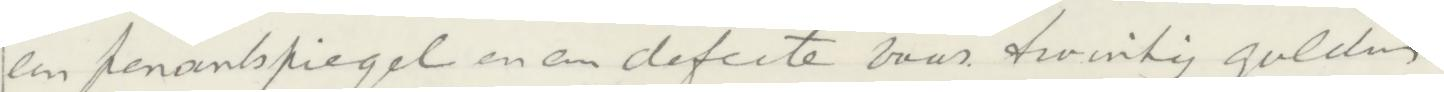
een penantspiegel en en defecte vaas. twintig gulden
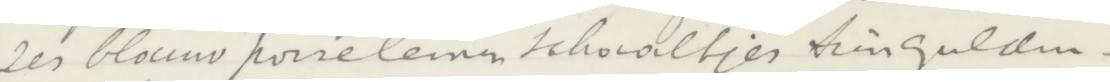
zes blauw porseleinen schaaltjes tien gulden
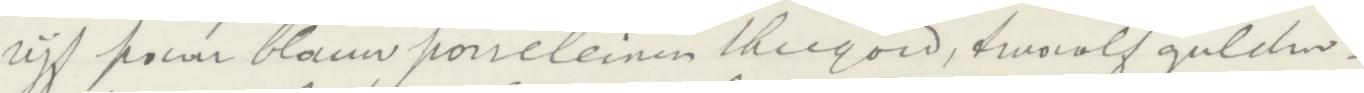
vijf paar blauw porseleinen theegoed, twaalf gulden
